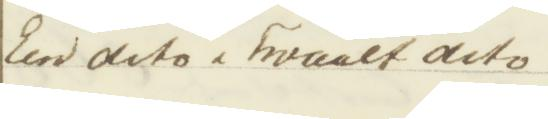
Een dito & Twaalf dito
